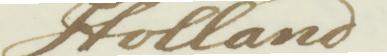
Holland
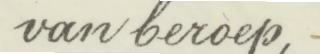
van beroep,
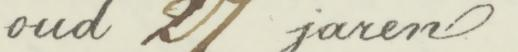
oud 27 jaren
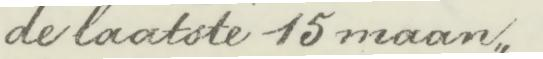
de laatste 15 maan„
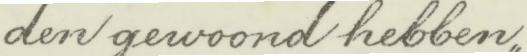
den gewoond hebben„
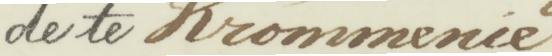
de te Krommenie
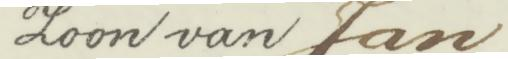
zoon van Jan
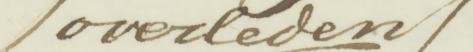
/overleden/
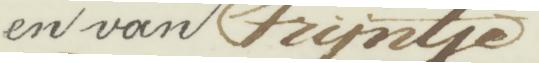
en van Trijntje
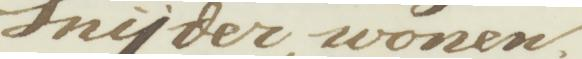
Snijder, wonen,
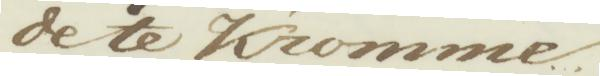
de te Kromme„
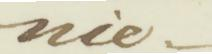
nie —
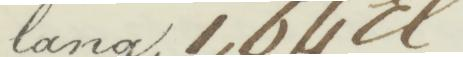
lang, 1,64 El
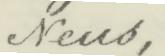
Neus,
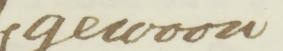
gewoon
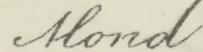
Mond
